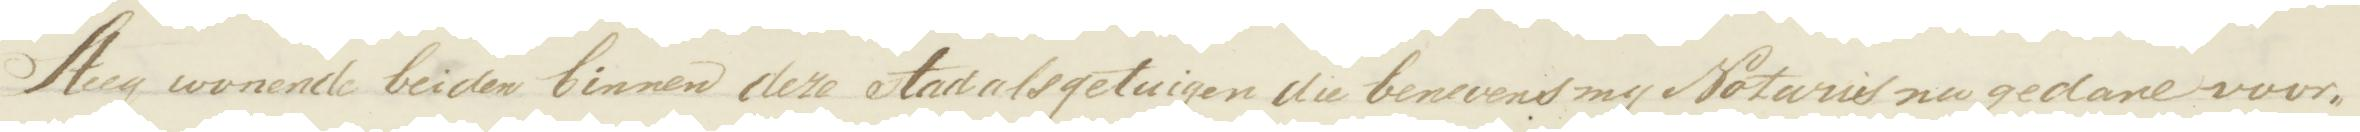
Steeg wonende beiden binnen deze Stad als getuigen die benevens my Notaris na gedane voor„
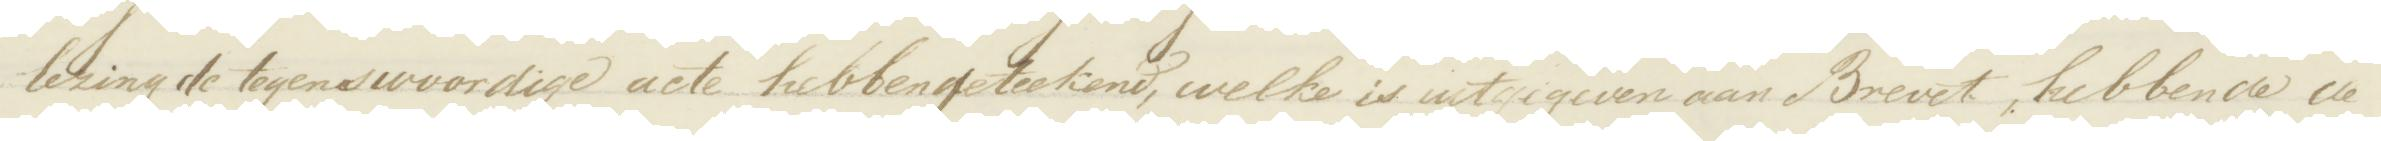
lezing de tegenswoordige acte hebben geteekend, welke is uitgegeven aan Brevet, hebbende de
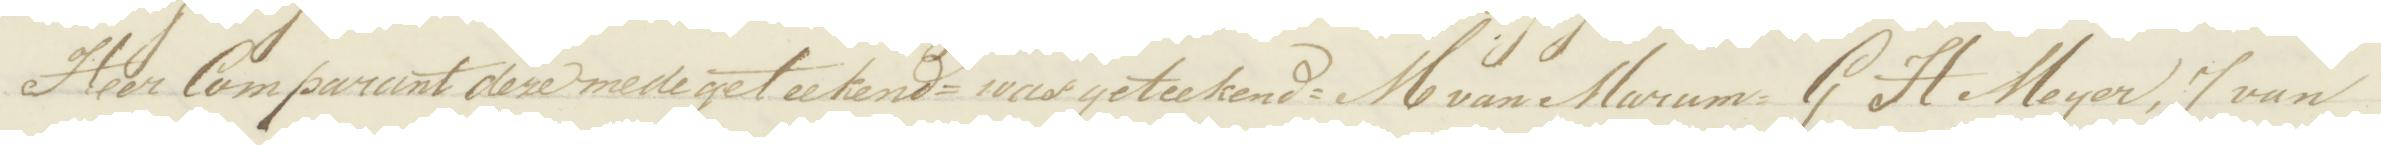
Heer Comparant deze mede geteekend = was geteekend = M van Marum= G H Meyer, J van
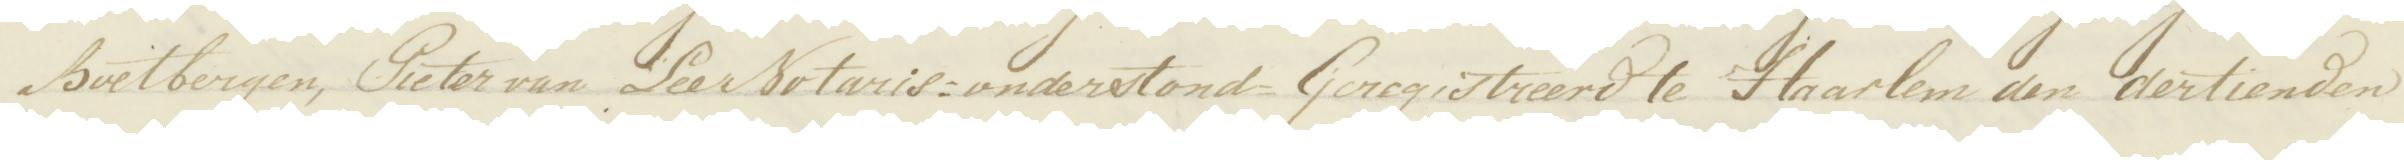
Boetbergen, Pieter van Lee Notaris =onderstond= Geregistreerd te Haarlem den dertienden
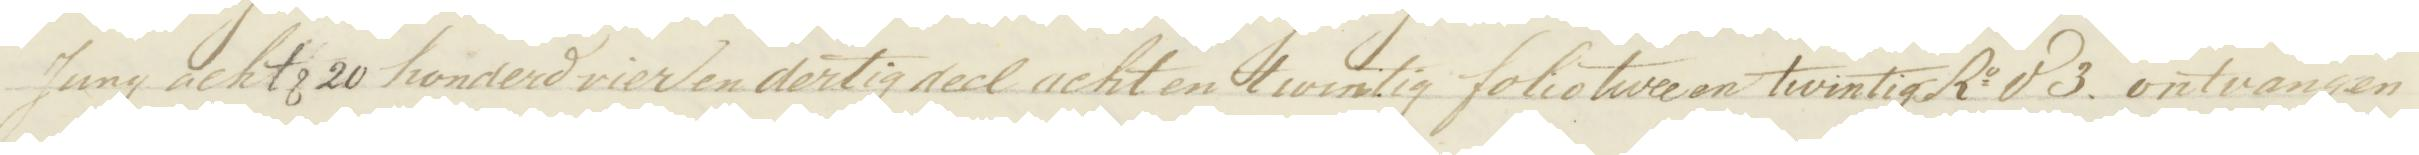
Juny acht en 20 honderd vier en dertig deel acht en twintig folio twee en twintig R=o V 3. ontvangen
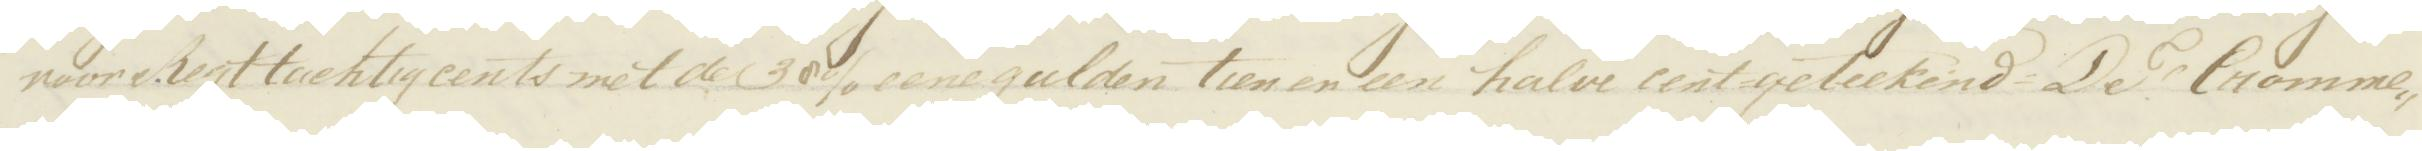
voor Regt tachtig cents met de 38% eene gulden tien en een halve cent =geteekend= DF Cromme„
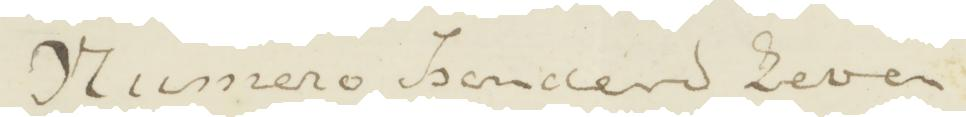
Numero Honderd Zeven
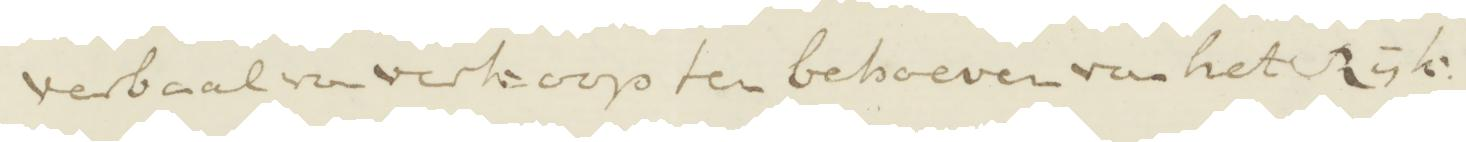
verbaal van verkoop ten behoeven van het Rijk.
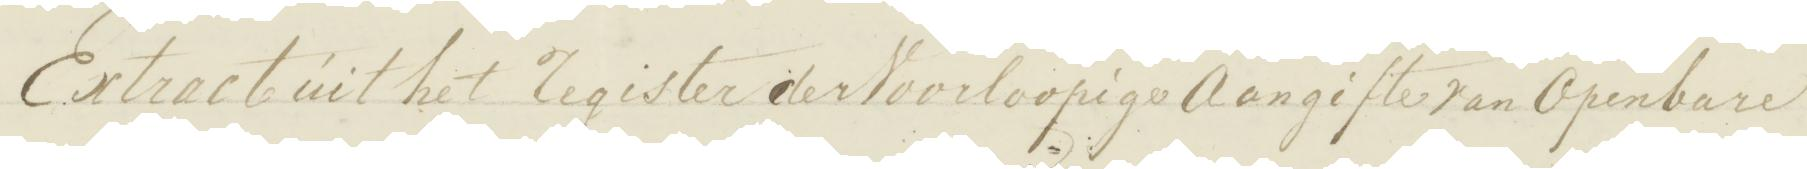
Extract uit het register der Voorloopige Aangifte van Openbare
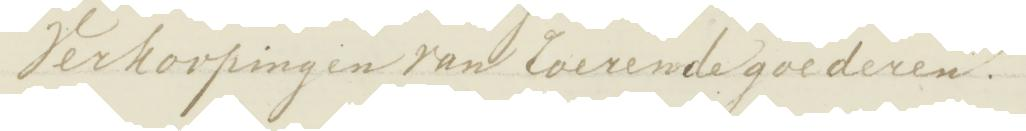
Verkoopingen en van roerende goederen.
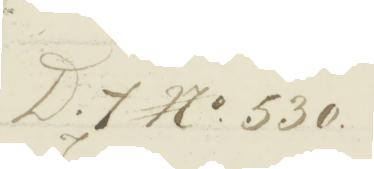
D. 7 N.o 530.
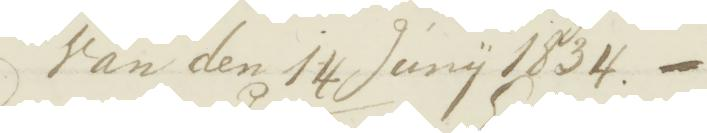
Van den 14 Junij 1834.
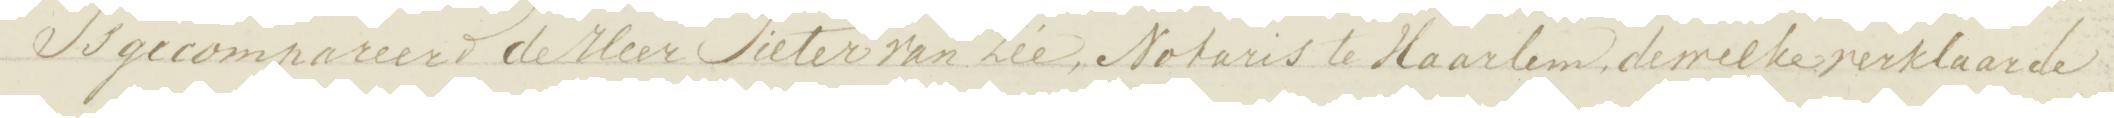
Is gecompareerd de Heer Pieter van Lée, Notaris te Haarlem, dewelke verklaarde
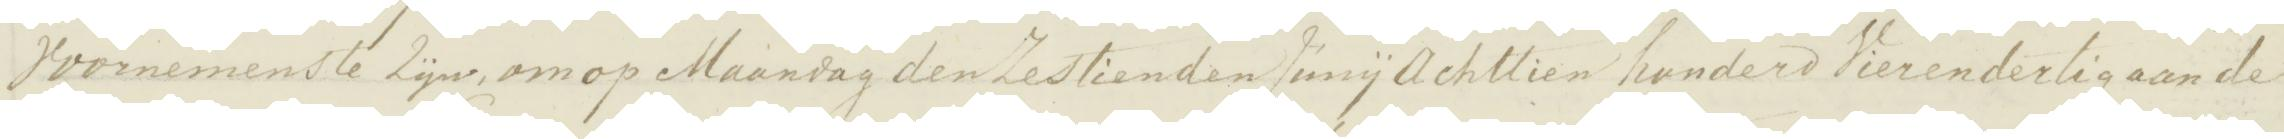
Voornemens te zijn, om op Maandag den Zestienden Junij Achttien honderd Vierendertig aan de
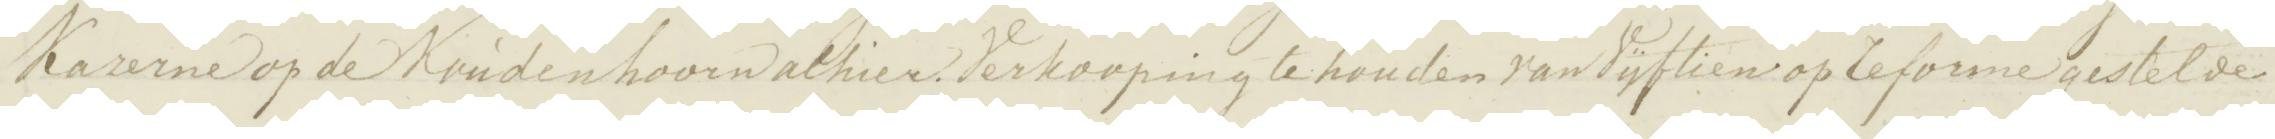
Kazerne op de Koudenhoorn alhier. Verkooping te houden van Vijftien op reforme gestelde
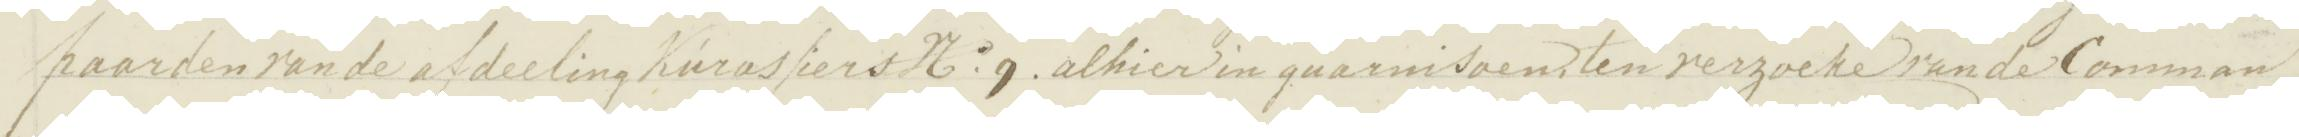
paarden van de afdeeling Kurassiers N.o 9. alhier in guarnisoen, ten verzoeke van de Comman
